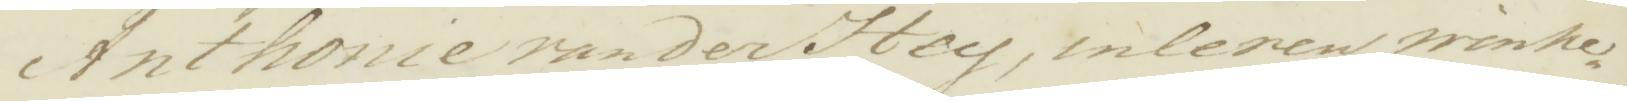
Anthonie van der Hey, in leven winke„
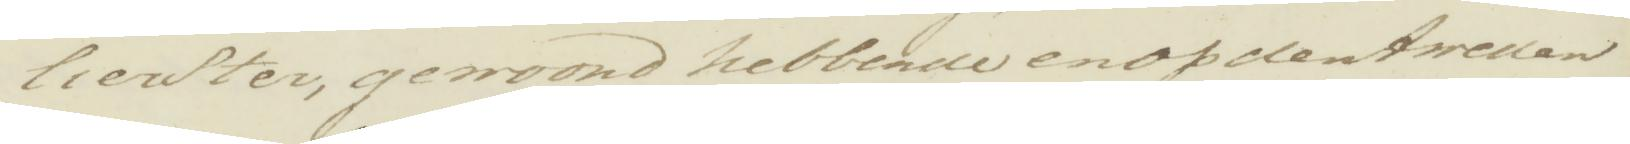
lierster, gewoond hebbende en op den tweden
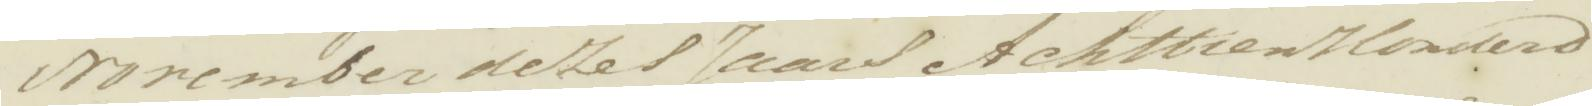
November dezes Jaars Achttien Honderd
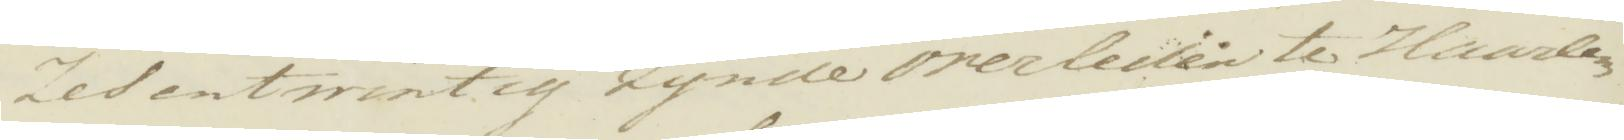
zes en twintig zijnde overleden te Haarlem
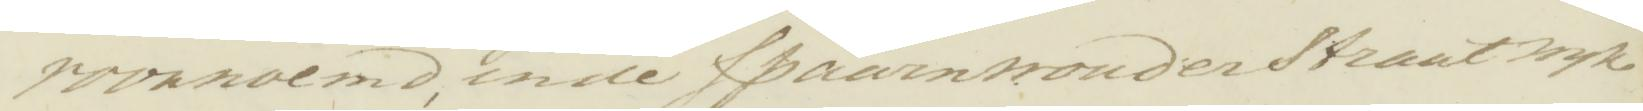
voornoemd, in de spaarnwouder straat wyk
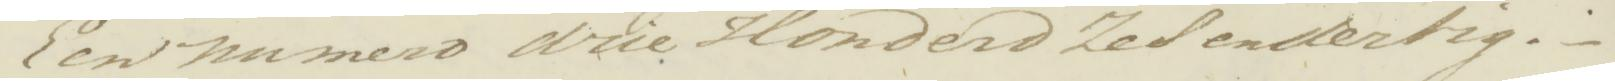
Een numero drie Honderd zes en dertig.-
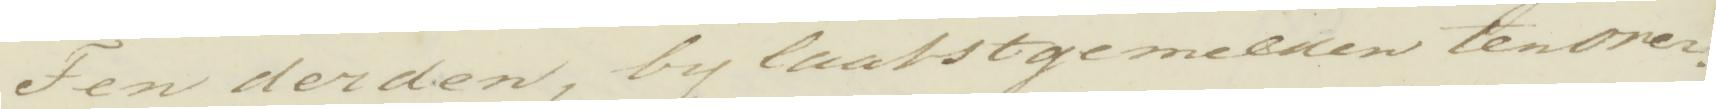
Ten derden, bij laatstgemelden ten over„
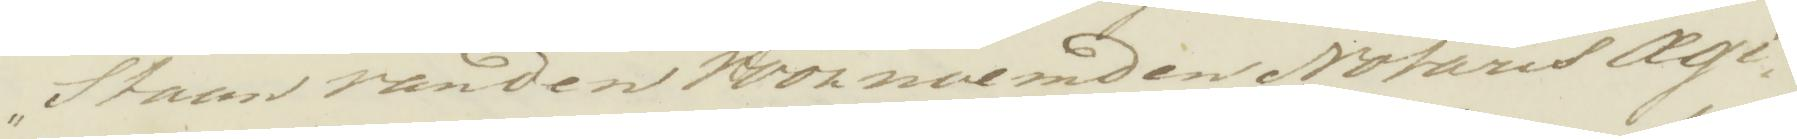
„staan van den voornoemden Notaris Agi„
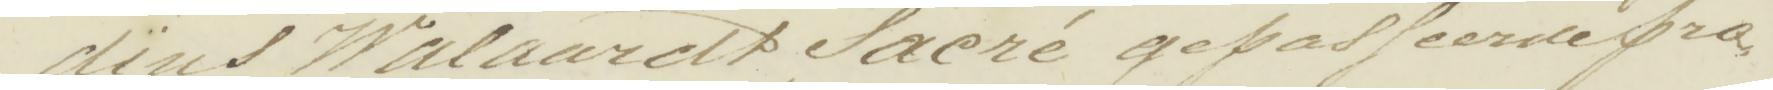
dïus Walaardt Sacré gepasseerde pro„
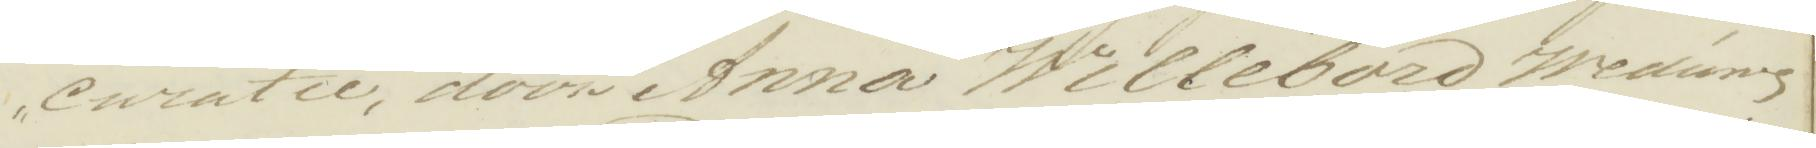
„curatie, door Anna Willebord weduwe
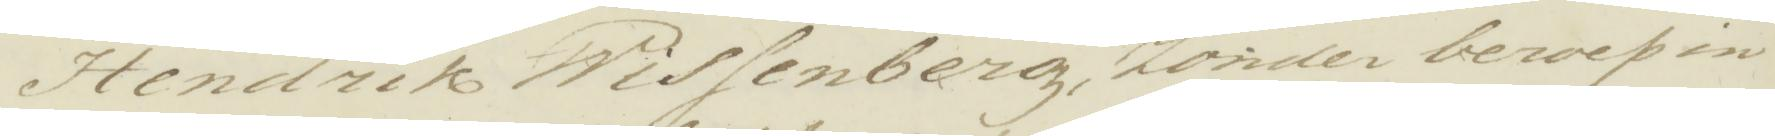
Hendrik Wissenberg, zonder beroep in
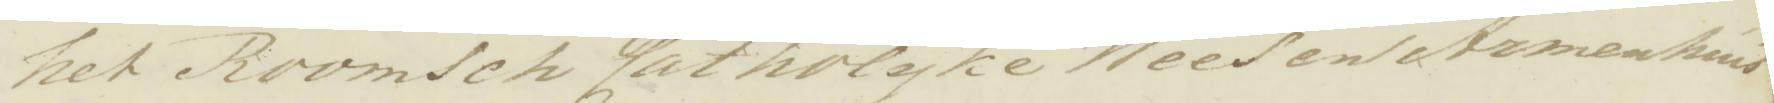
het Roomsch Catholyke Wees en Armenhuis
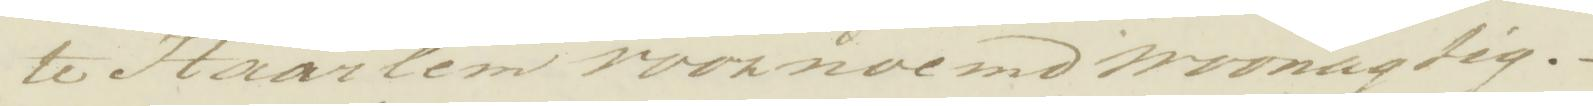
te Haarlem voornoemd woonagtig.
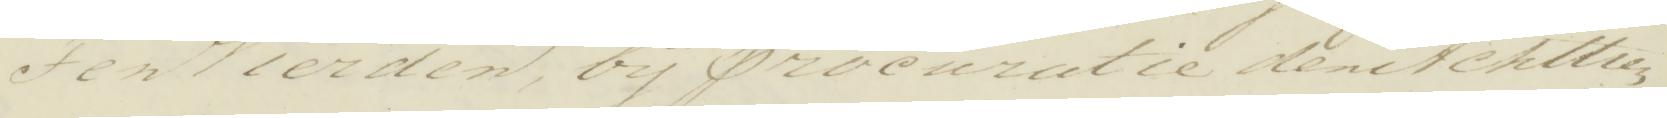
Ten Vierden, bij procuratie den Achttien
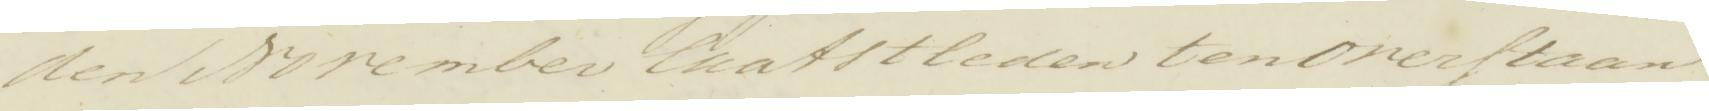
den November laatstleden ten overstaan
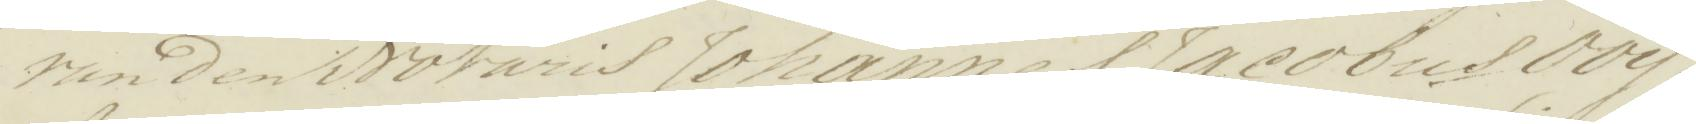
van den Notaris Johannes Jacobus Oog
